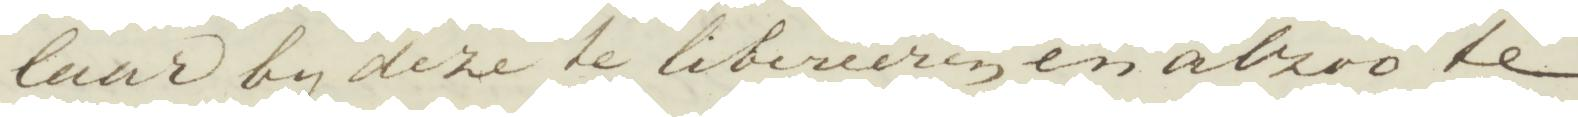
laar by deze te libereeren en alzoo te
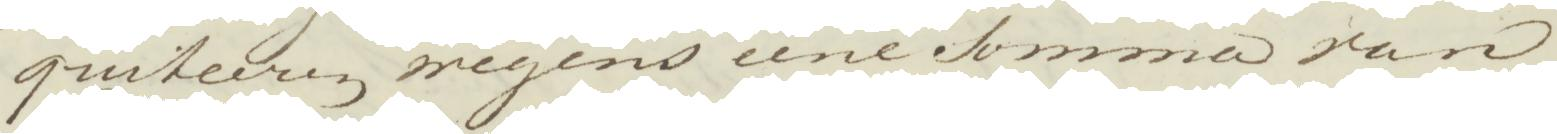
quiteeren wegens eene somma van
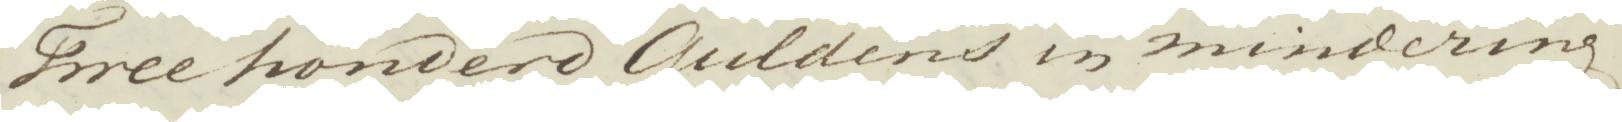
Twee honderd Guldens in mindering
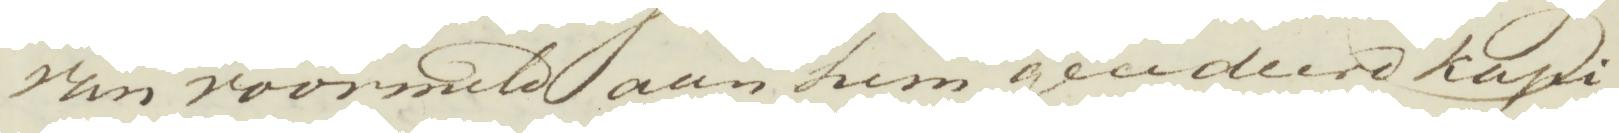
van voormeld aan hem gecedeerd kapi=
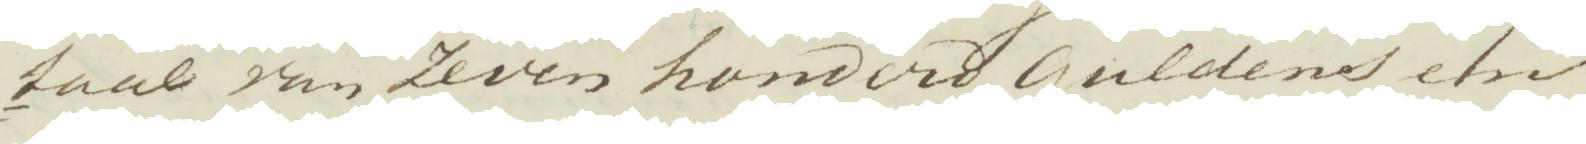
=taal van zeven honderd Guldens, en
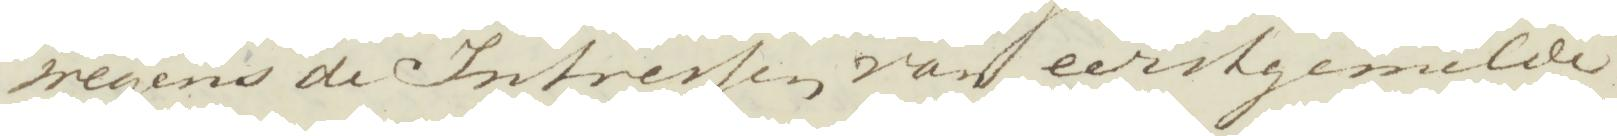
wegens de Jntressen van eerstgemelde
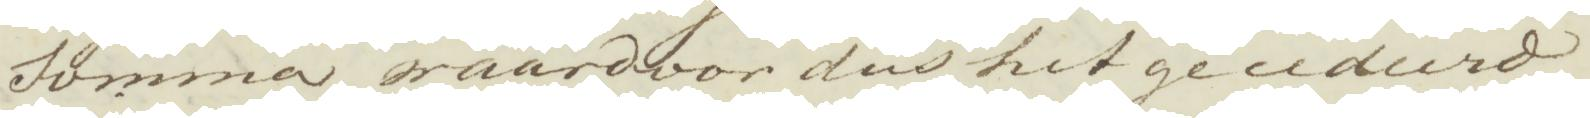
somma waardoor dus het gecedeerd
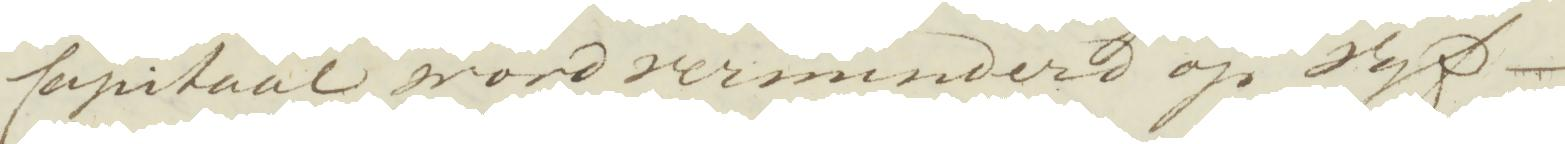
Capitaal word verminderd op Vyf=
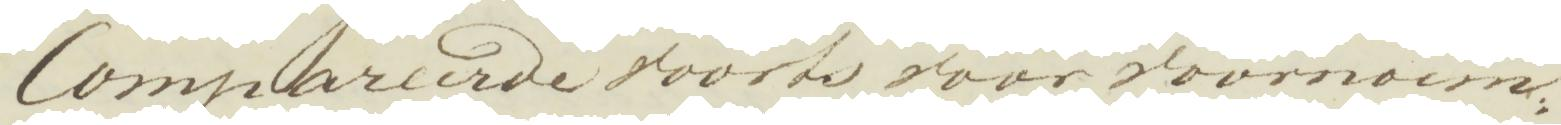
Compareerde voorts voor voornoem=
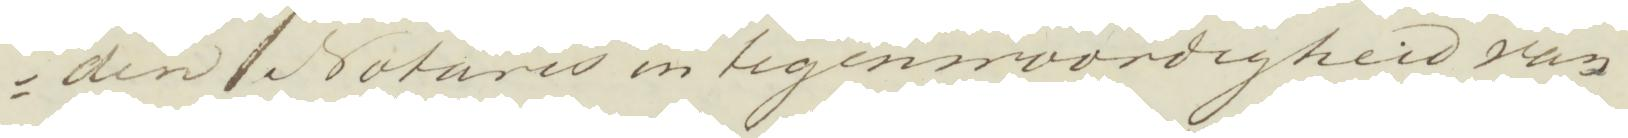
=den Notaris in tegenwoordigheid van
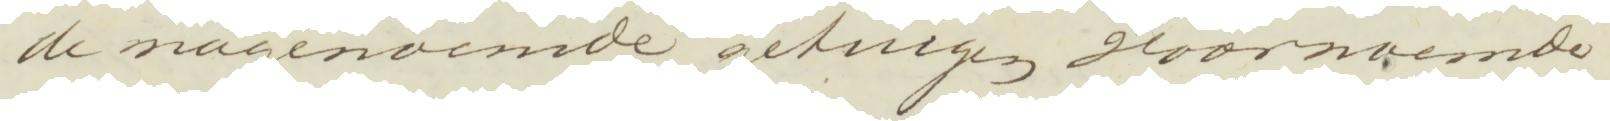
de nagenoemde getuigen voornoemde
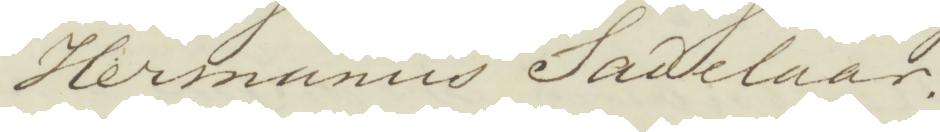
Hermanus Sadelaar
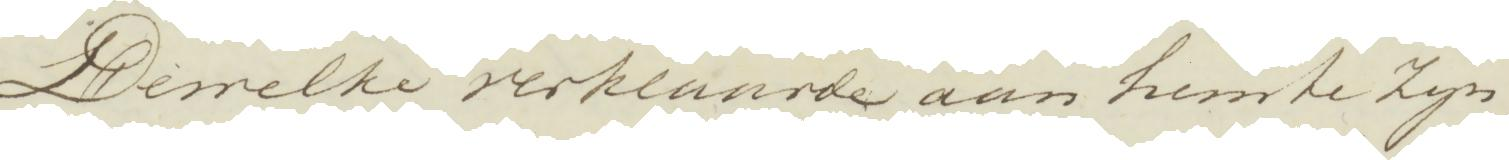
Dewelke verklaarde aan hem te zyn
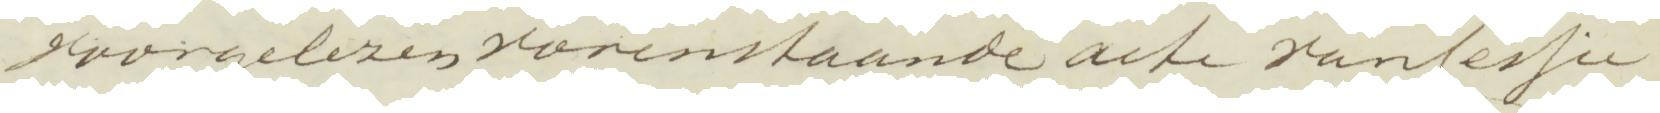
voorgelezen vorenstaande acte van Cessie
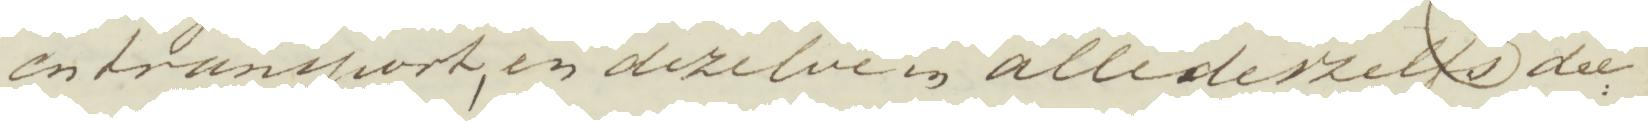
en transport, en dezelve in alle deszelfs dee=
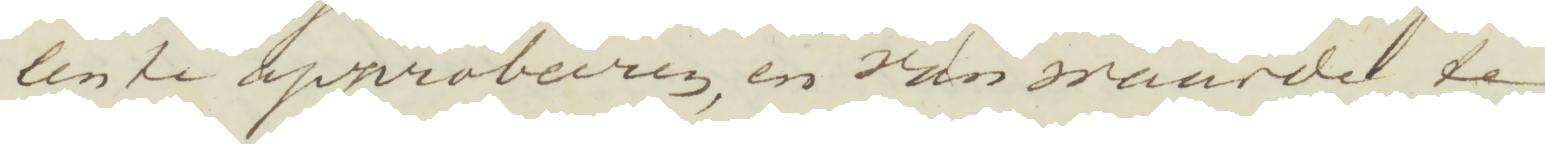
len te approbeeren, en van waarde te
